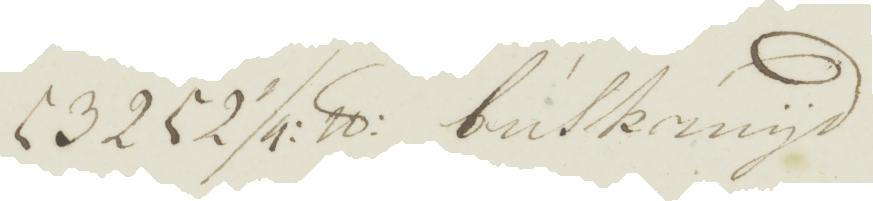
53252¼: lb: buskruijd
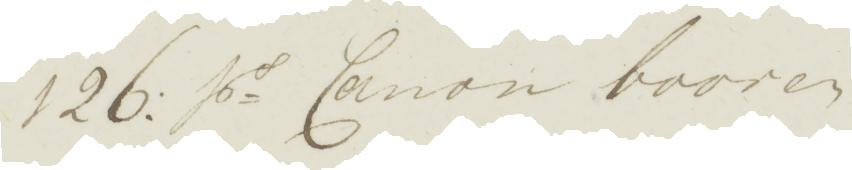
126: p=s Canon booren
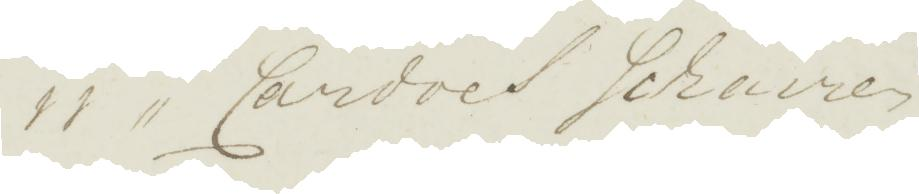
11 „ Cardoes schairen
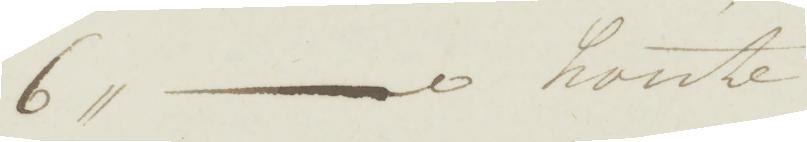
6 „ _o houte
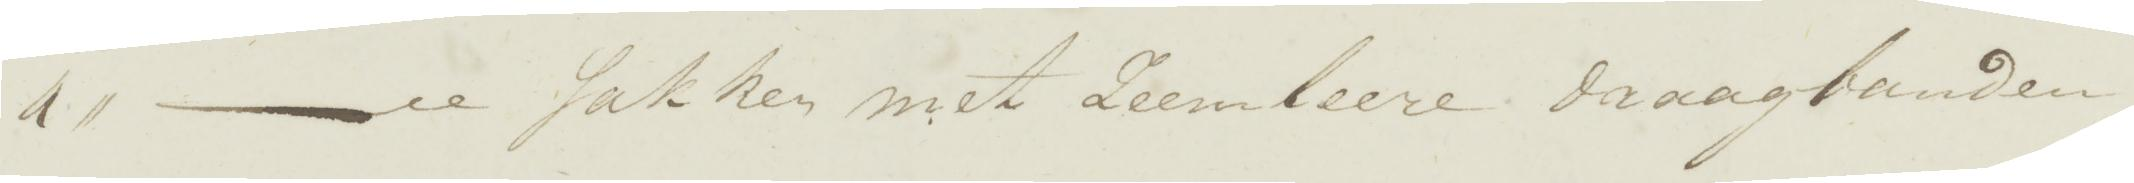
4 „ _o sakken met zeemleere draagbanden
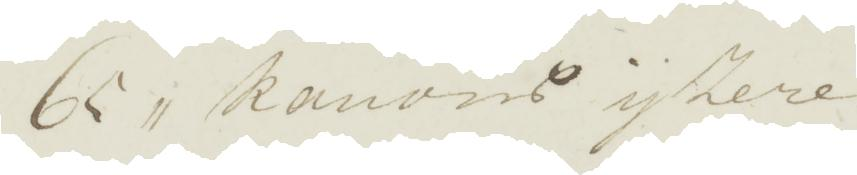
65 „ kanons ijzere
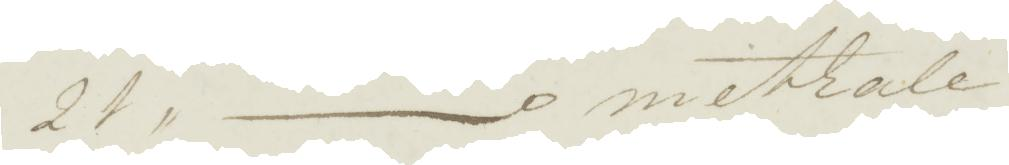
21 „ _o methale
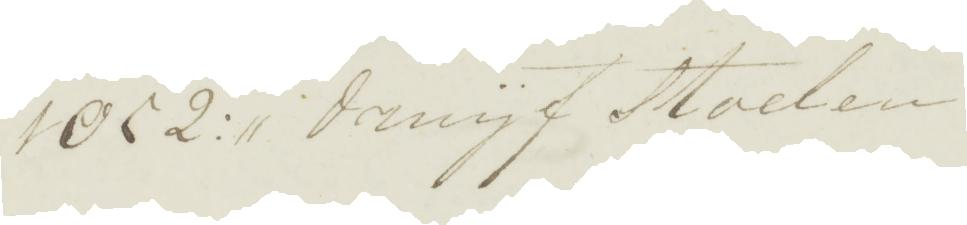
1052: „ druijf stoelen
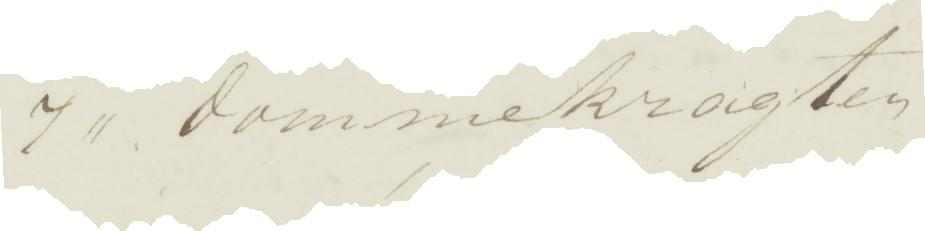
7 „ dommekragten
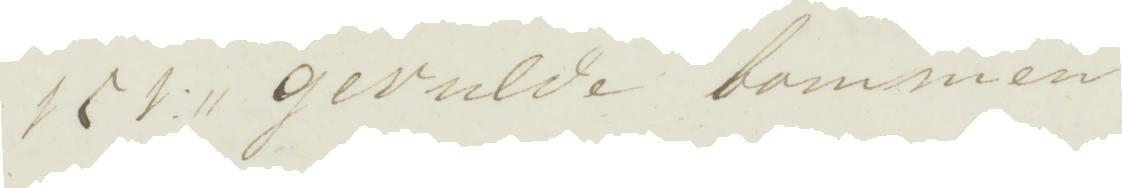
151: „ gevulde bommen
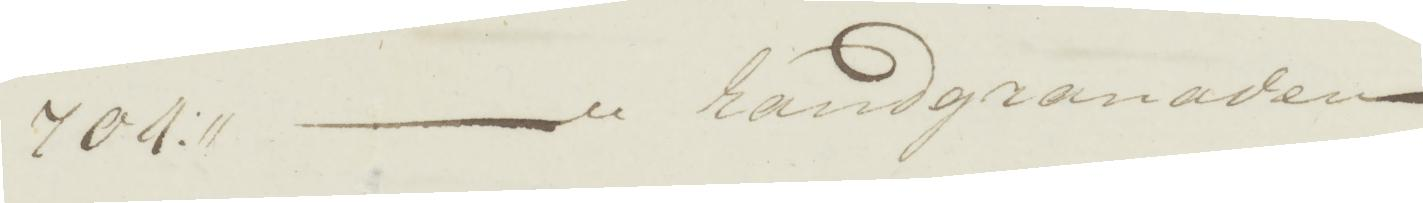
704: „ _o handgranaden
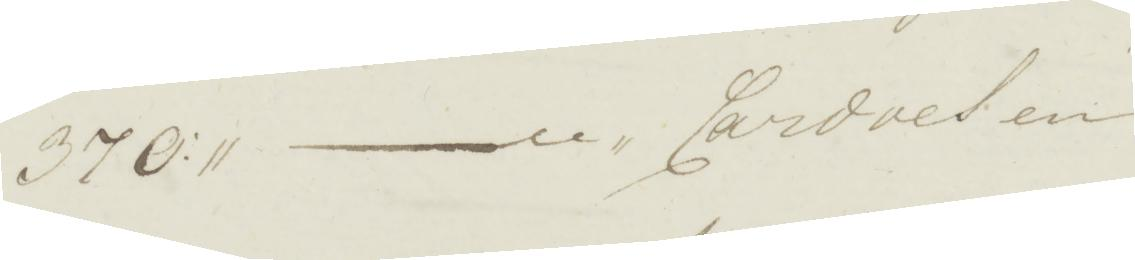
370: „ _o Cardoes en
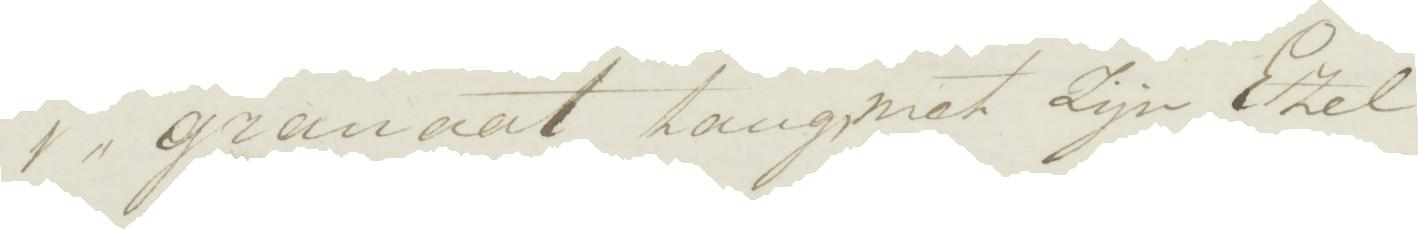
1 „ granaat tang, met zijn Ezel
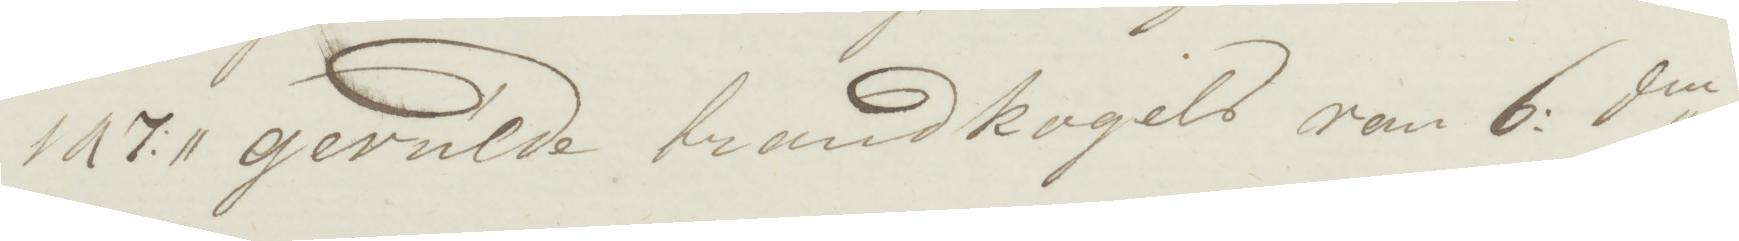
147: „ gevulde brandkogels van 6: d„m
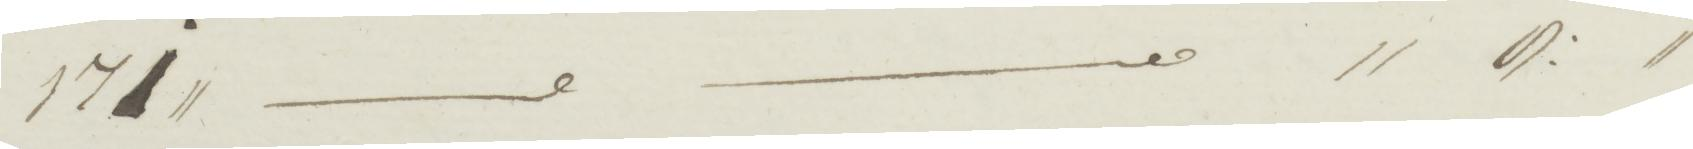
171„ _o _o „ 8: „
